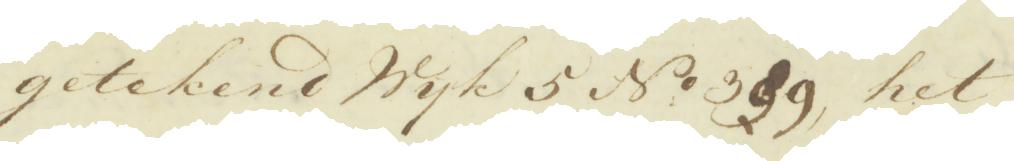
getekend Wyk 5 N:o 399, het
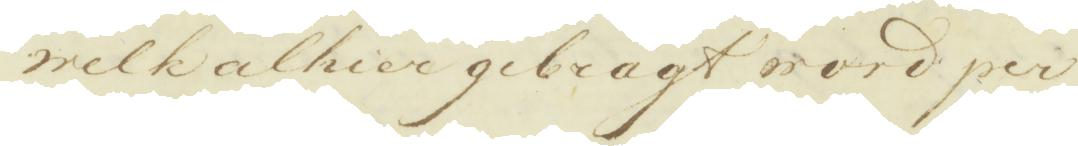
welk alhier gebragt word per
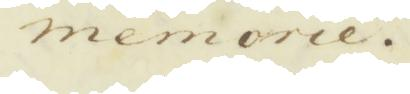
memorie.
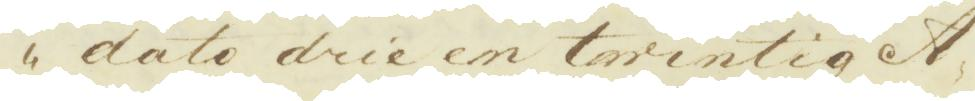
„ dato drie en twintig A„
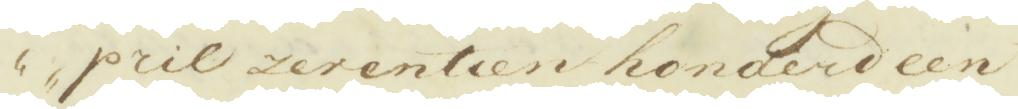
„ „pril zeventien honderd een
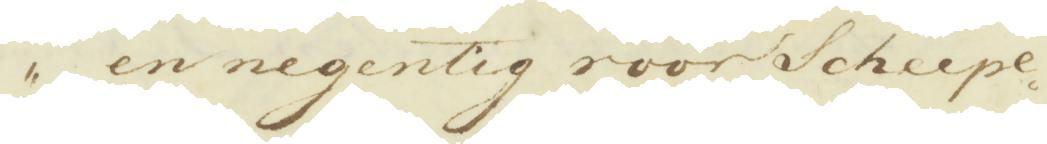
„ en negentig voor scheepe„
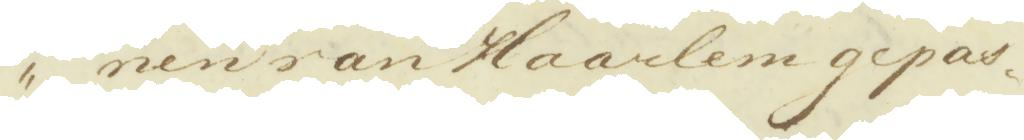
„ nen van Haarlem gepas„
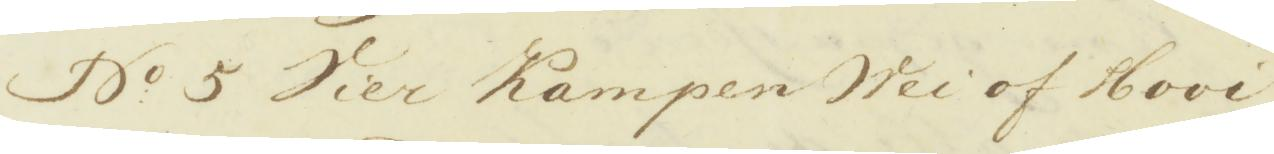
N:o 5 Vier Kampen Wei of Hooi
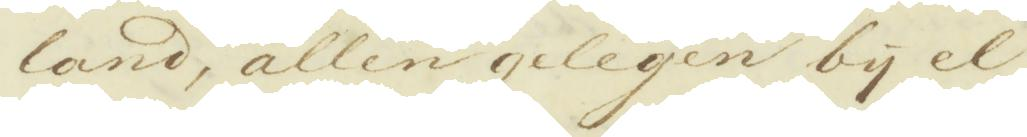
land, allen gelegen bij el
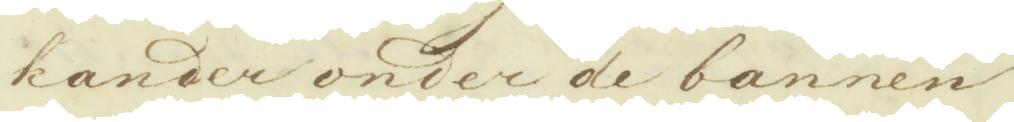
kander onder de bannen
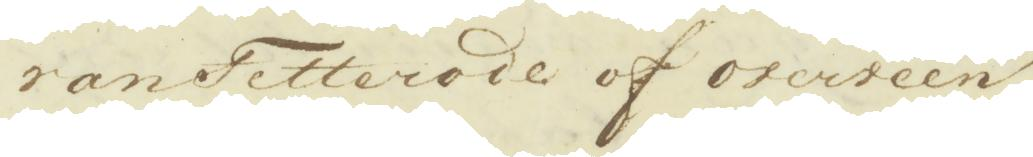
van Tetterode of overveen,
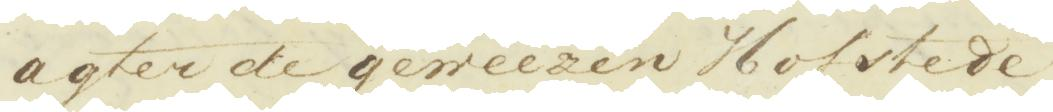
agter de geweezen Hofstede
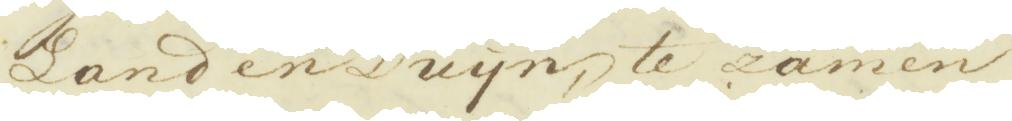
Land en Duijn, te zamen
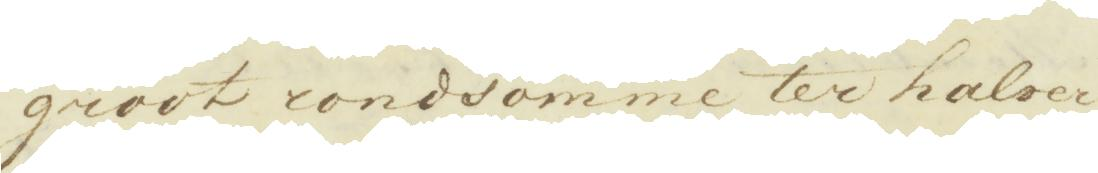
groot rondsomme ter halver
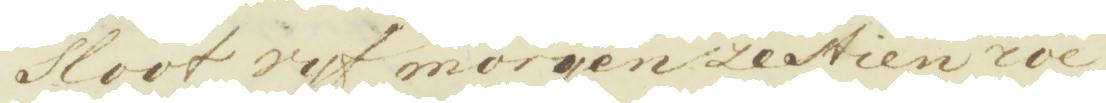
sloot vyf morgen zestien roe
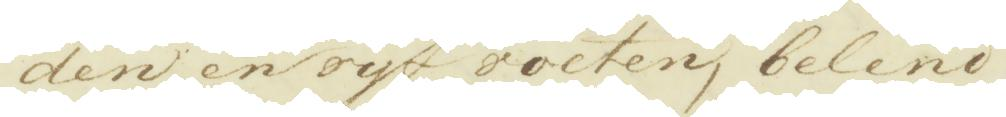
den en vyf voeten, belend
